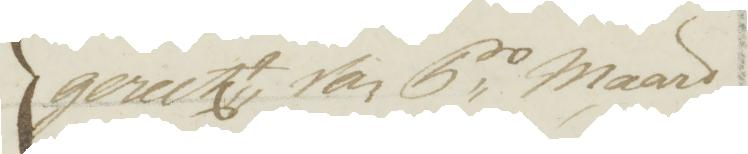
gereek„t van P„o maand
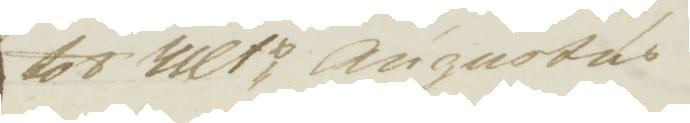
tot ult„o augustus
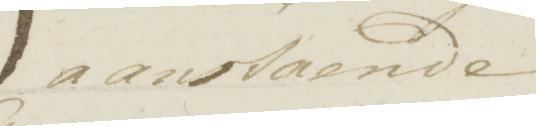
aanstaende
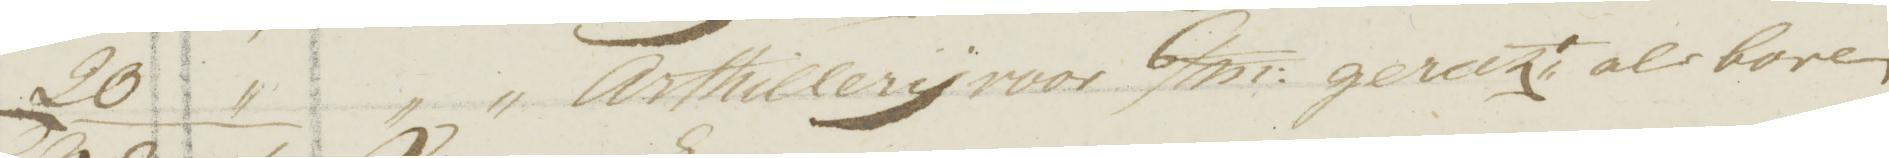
20 „ „ „ Arthillerij voor 6/m: gereek„t als bove
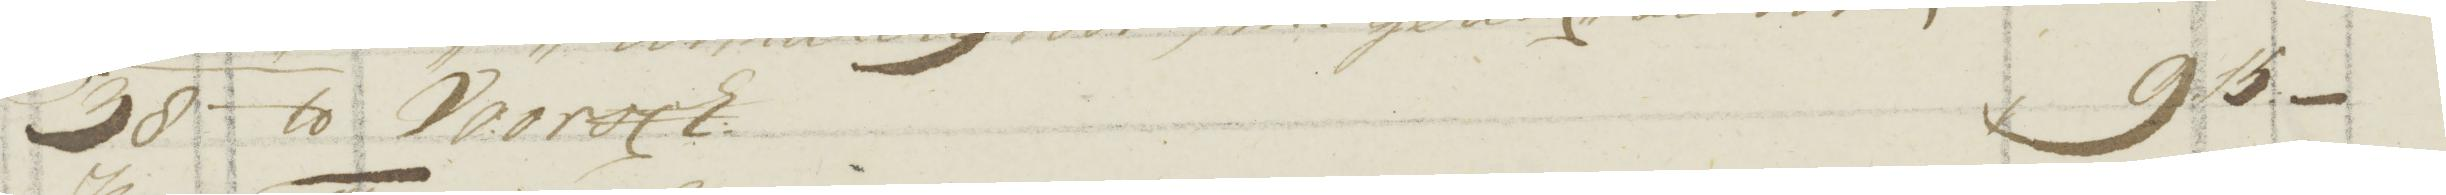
38 lb Voorsch: 9. 15: —
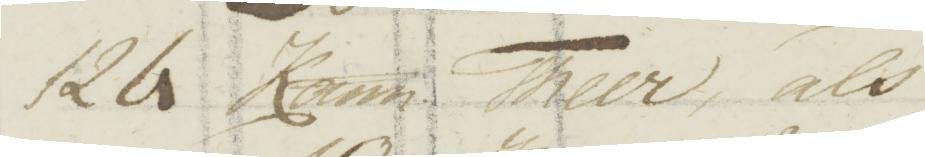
124 Kann. Theer, als
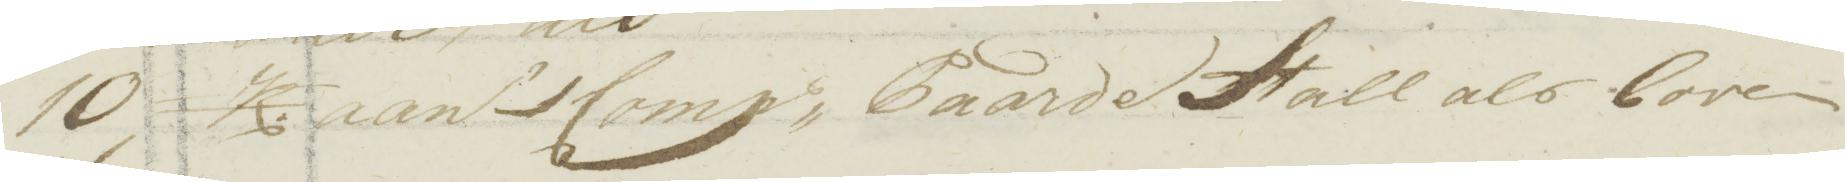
10 K: aan ’s Comp„s Paarde stall als boven
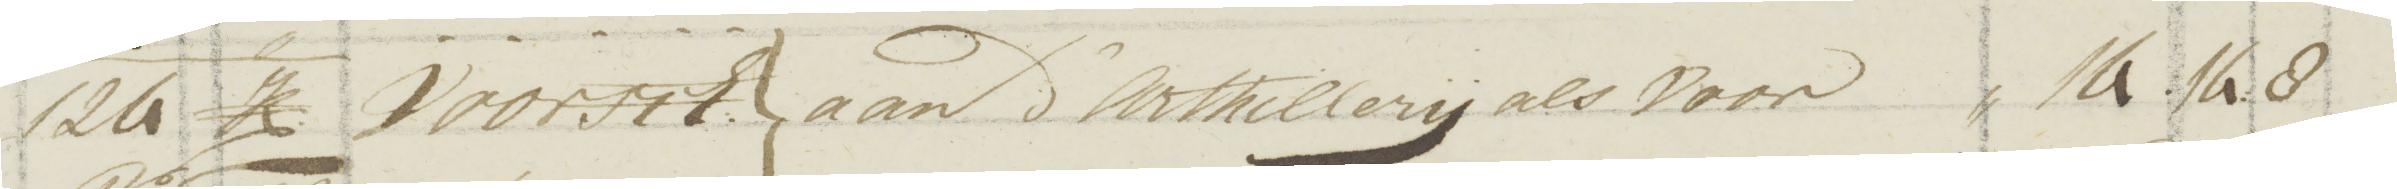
124 K: Voorsch: aan d' Arthillerij als voor „ 14: 14: 8.
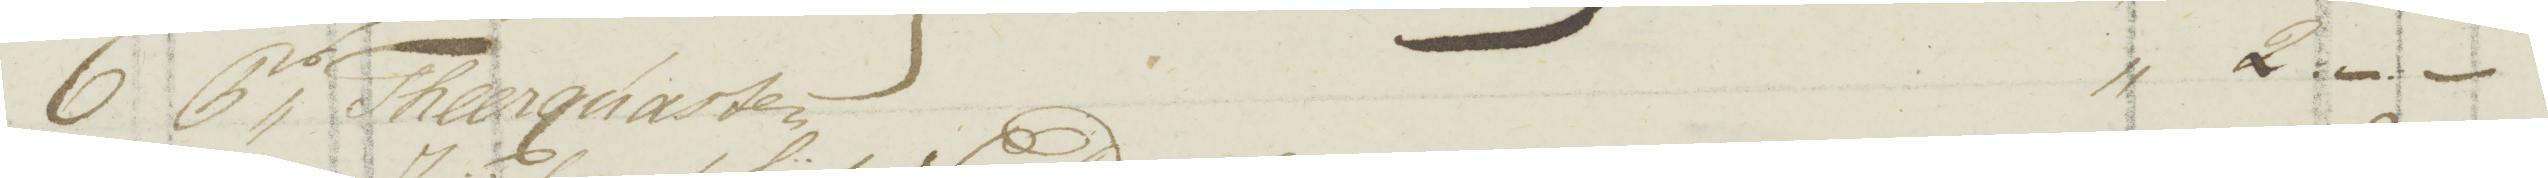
6 P„s Theerquasten „ 2: —. —
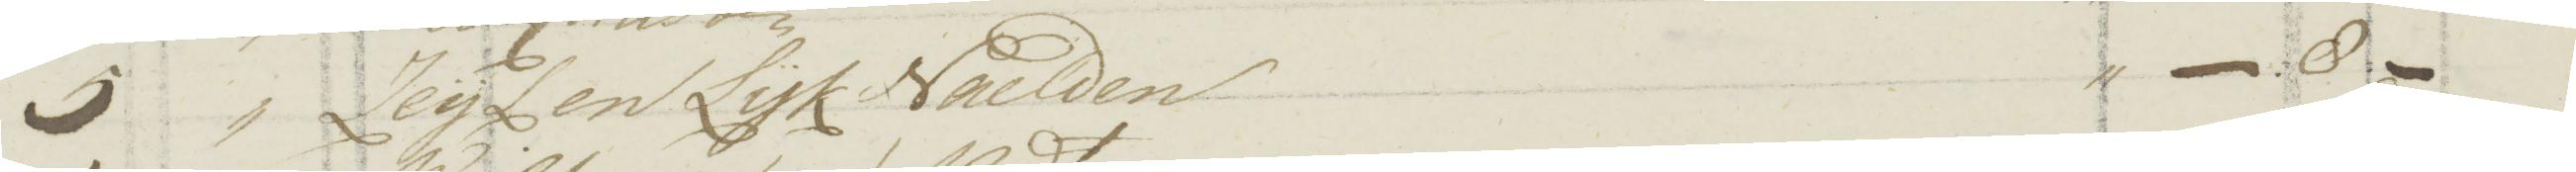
5 „ zeijl len Lijk Naelden „ —. 8. —
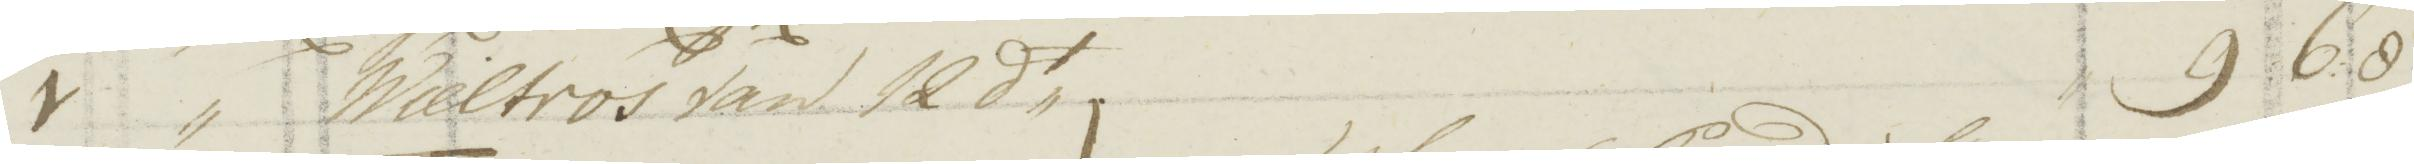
1 „ Wieltros van 12 d„t „ 9: 6: 8
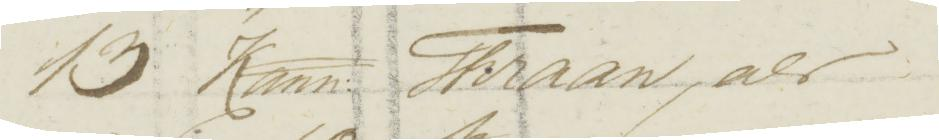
13: Kann Thraan, als
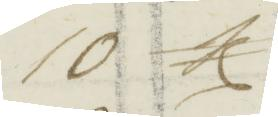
10 K
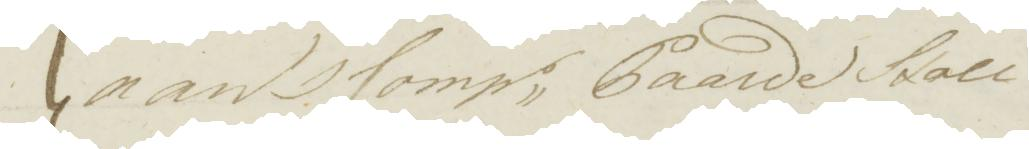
aan s Comp„s Paarde stall
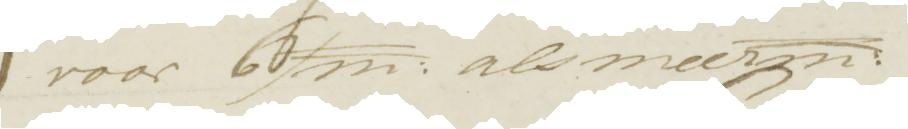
voor 6/m: als meerm:
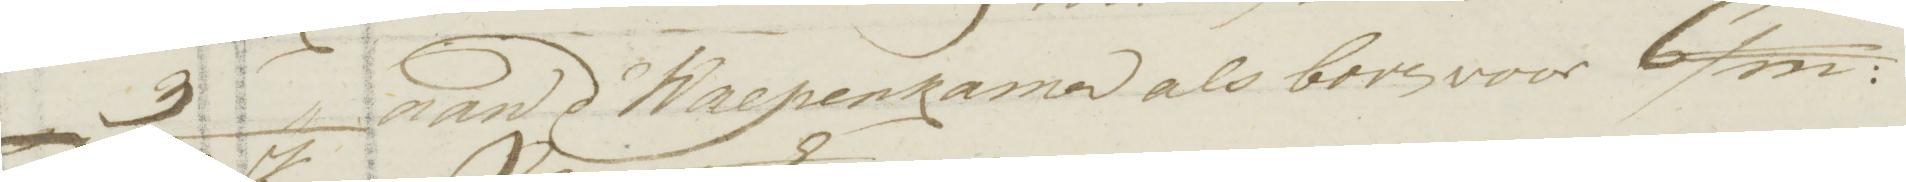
3 „ aan d’ Waepenkamer als boven voor 6/m:
